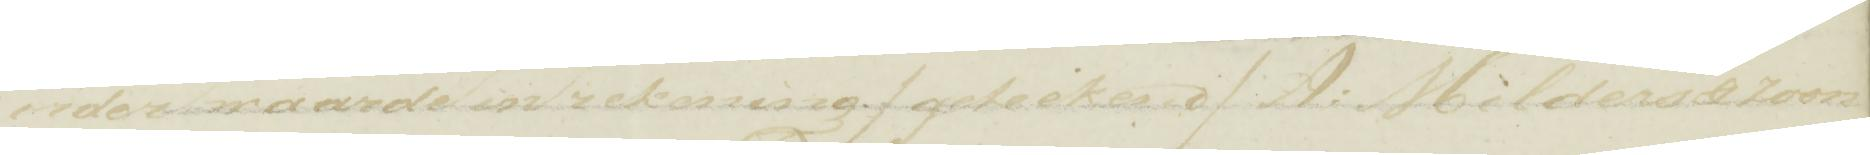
order waarde in rekening / geteekend / A: Milders & zoon
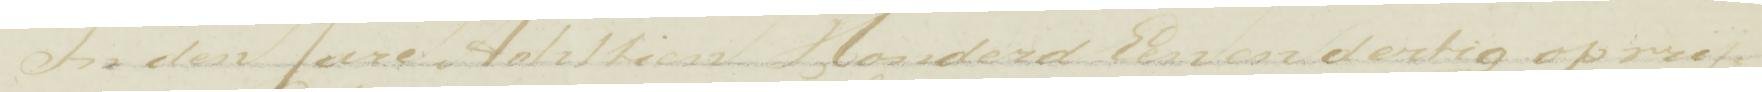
In den Jare Achttien Honderd Een en dertig op vrij„
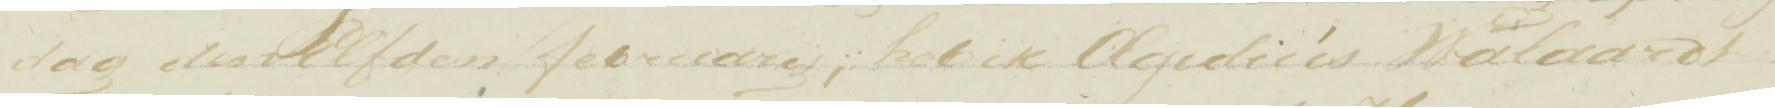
dag den Elfden Februarij, heb ik AEgidius Walaardt
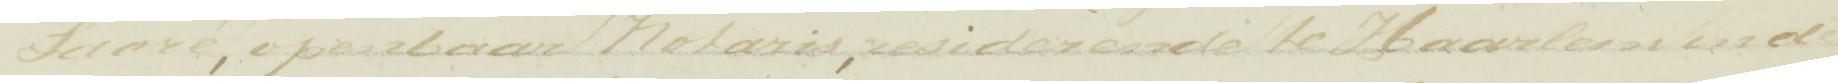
Sacré, openbaar Notaris, residerende te Haarlem in de
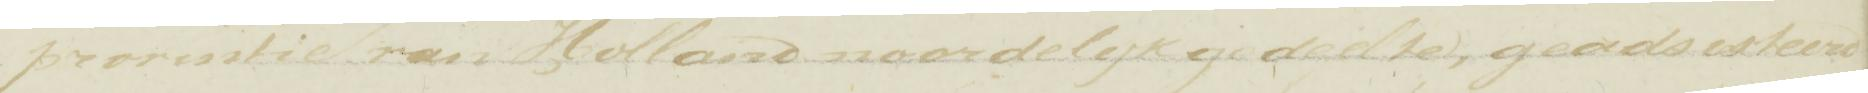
provintie van Holland noordelyk gedeelte, geadsisteerd
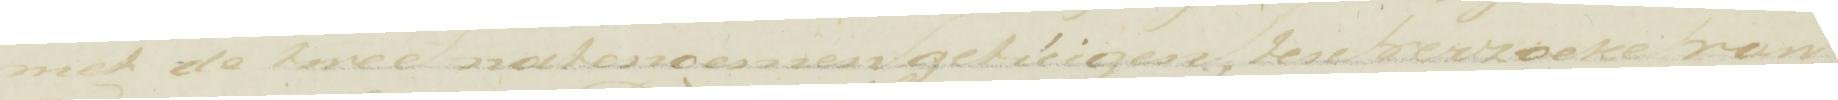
met de twee natenoemen getuigen, ten verzoeke van
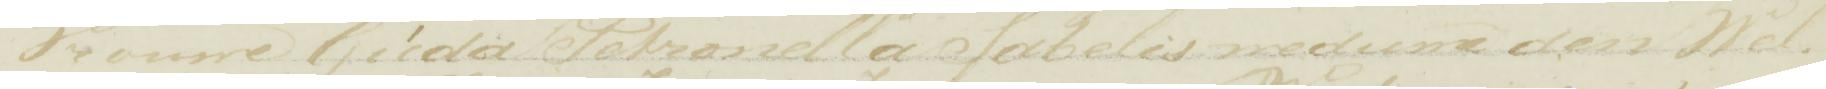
Vrouwe Guda Petronella Sabelis weduwe den Wel
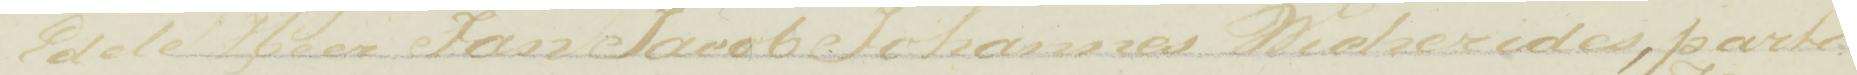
Edele Heer Ian Iacob Iohannes Nicherides, parti
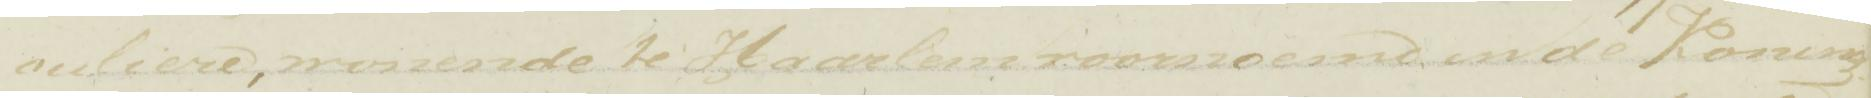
culiere, wonende te Haarlem voornoemd in de Koning
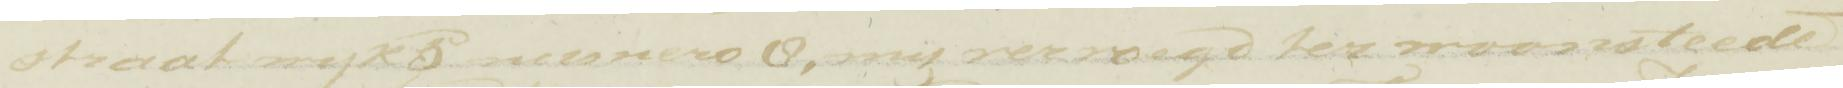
straat wyk 5 numero 8, mij vervoegd ter woonsteede
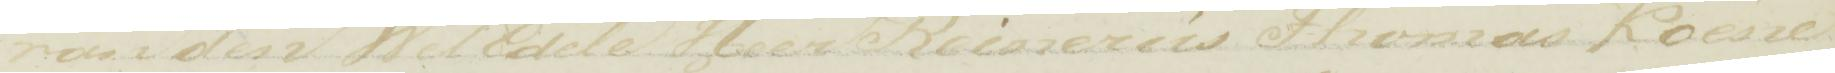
van den WelEdele Heer Reinerus Thomas Koene
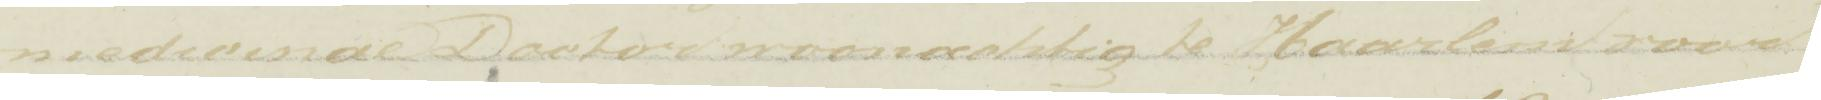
medicinae Doctor woonachtig te Haarlem voor
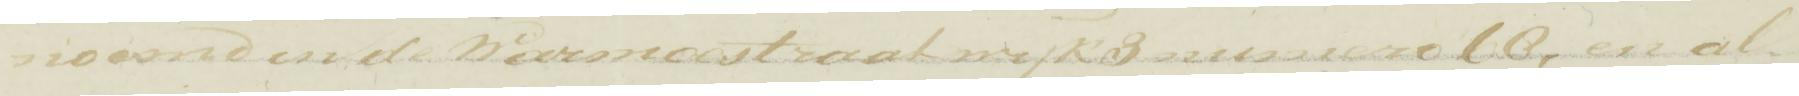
noemd in de Warmastraat wyk 3 numero 68, en al„
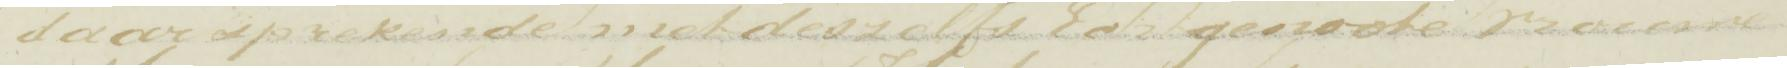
daar sprekende met deszelfs Echtgenoote vrouwe
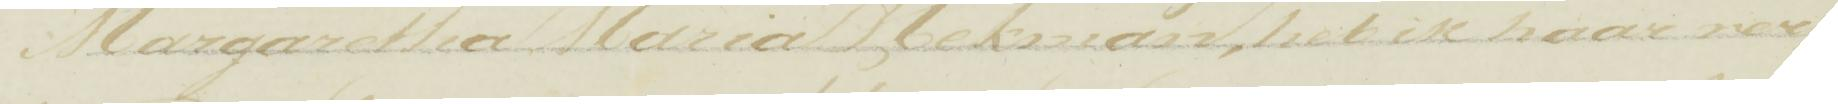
Margartha Maria Hekman, heb ik haar ver
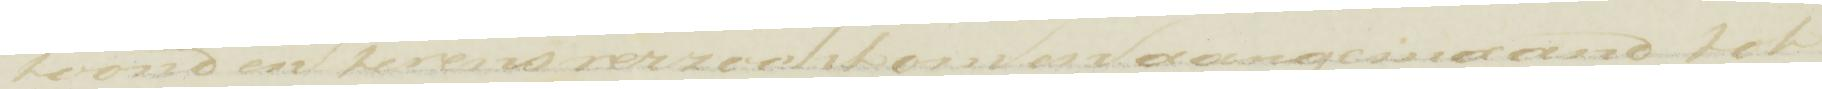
toond en tevens verzocht om en aangemaand tot
